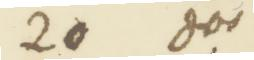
20 d:os
